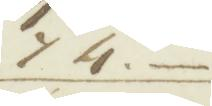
74. —
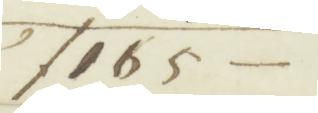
ƒ165 —
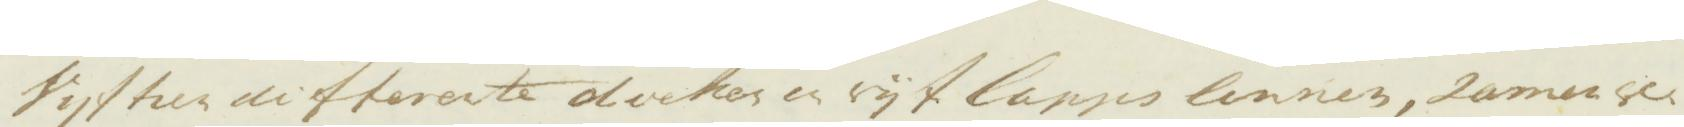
Vyftien differente doeken en vijf lapps linnen, zamen ge
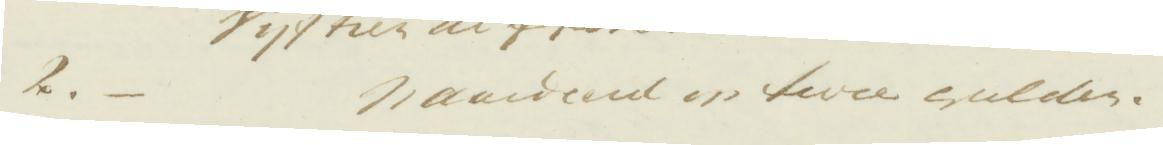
2. — waardeerd op twee gulden.
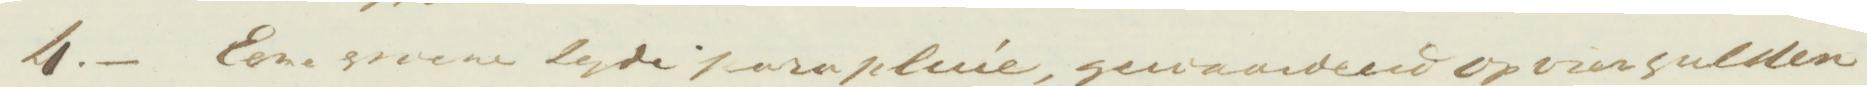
4. — Eene groene zyde parapluie, gewaardeerd op vier gulden
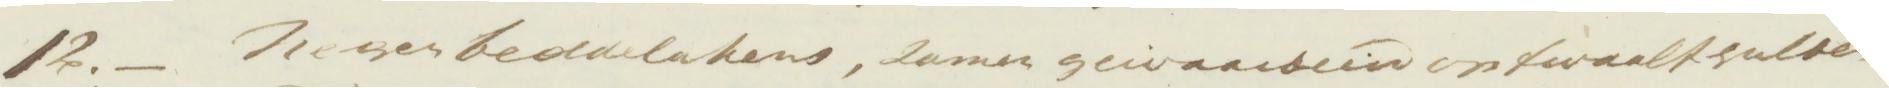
12. — Negen beddelakens, zamen gewaardeerd op twaalf gulden
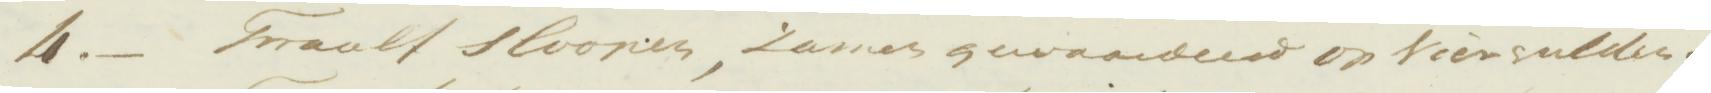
4. — Twaalf sloopen, zamen gewaardeerd op Vier gulden.
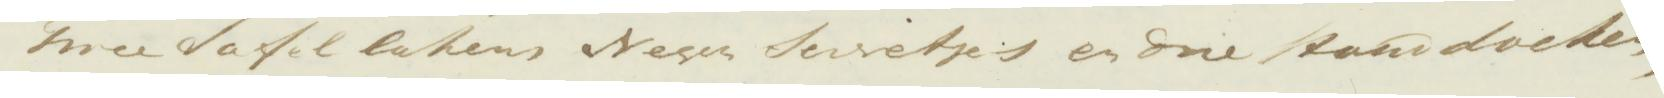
Twee tafel lakens Negen Servetjes en drie handdoeken
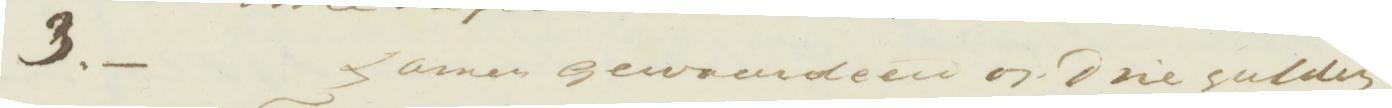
3. — zamen gewaardeerd op drie gulden
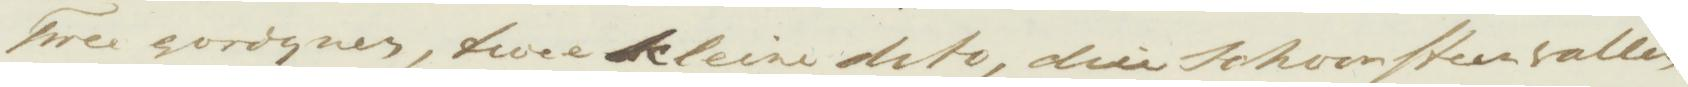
Twee gordynen, twee kleine dito, drie schoonsteen vallen
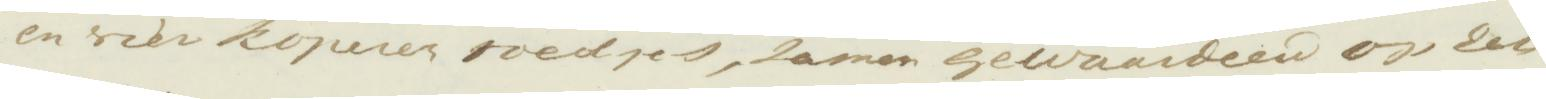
en vier koperen voedjes, zamen gewaardeerd op Een
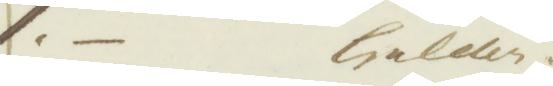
1. — Gulden
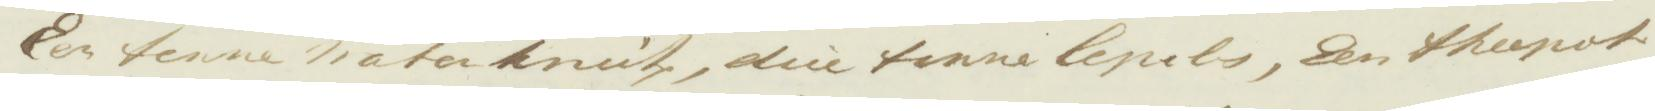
Een tinne waterkruik, drie tinne lepels, Een theepot
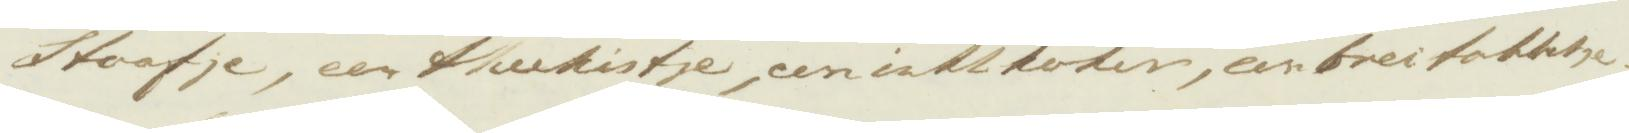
stoofje, een theekistje, een inktkoker, een breitobbetje
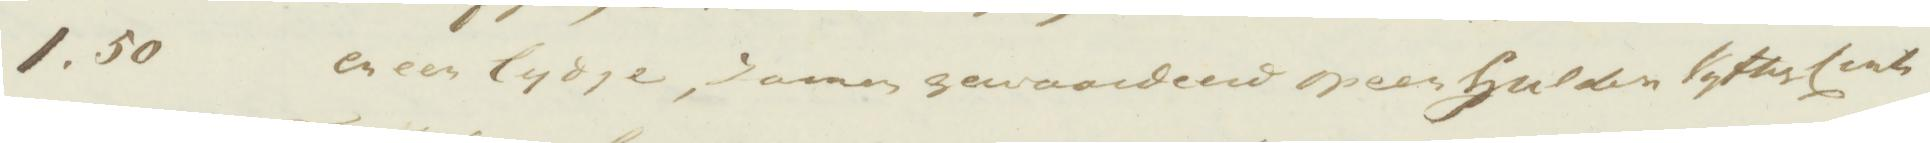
1.50 en een lydje, zamen gewaardeerd op een Gulden Vyftig Cents
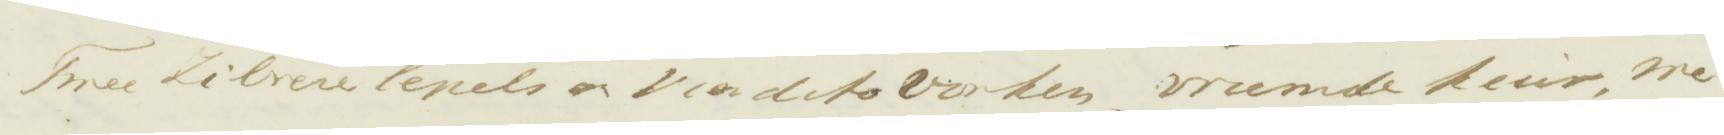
Twee Zilvere lepels en vier dito vorken, vreemde keur, we
